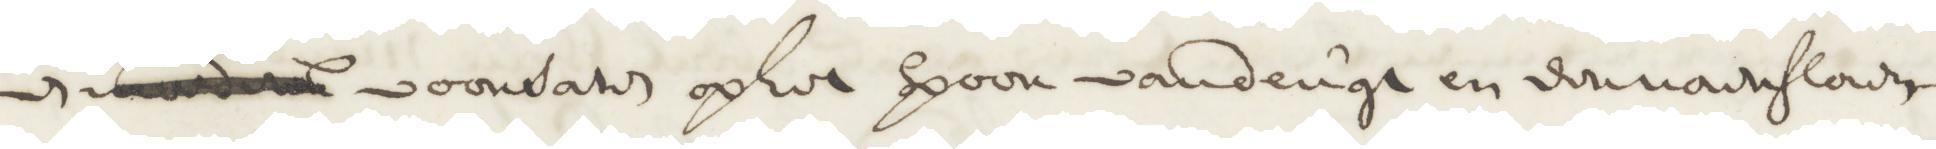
en vaderlik voorsaten op het spoor van deugt en eer naerslaen
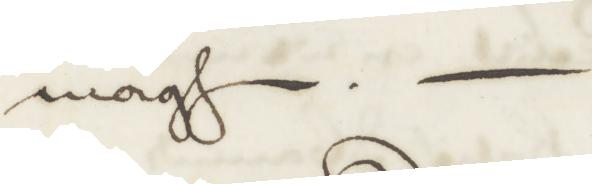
magh.—
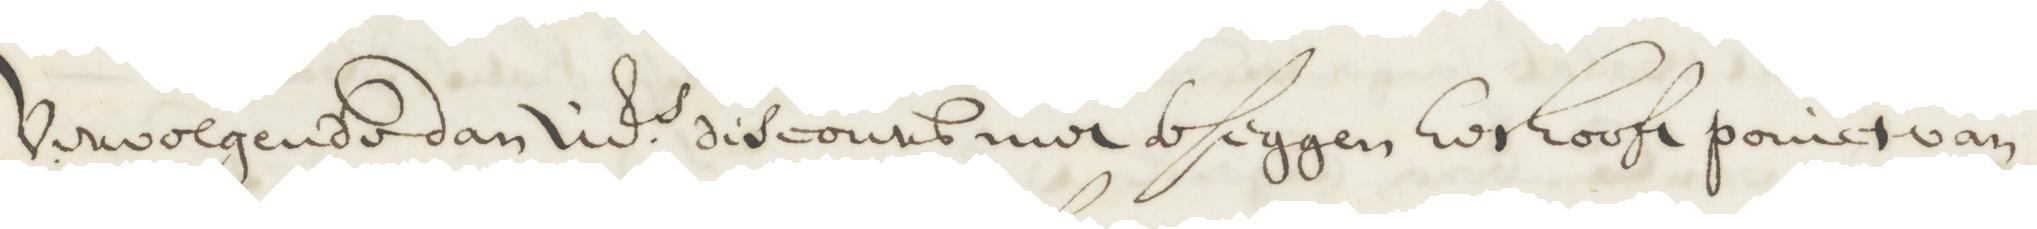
vervolgende dan uE.s discours met te seggen het hooft poinct van
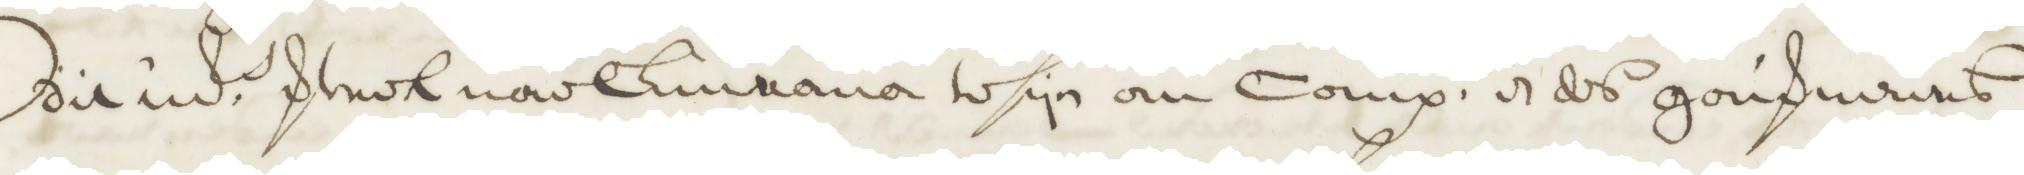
dit uE.s vertrek nae Chinrana te sijn om Comp:s en des gouverneurs
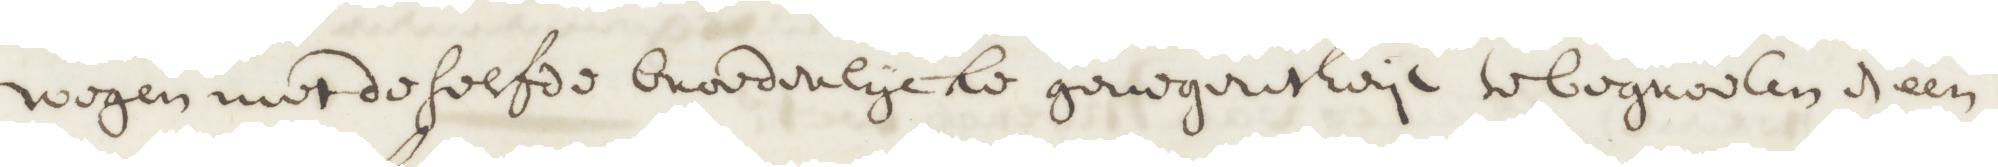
wegen met deselfde broederlijcke genegentheijt te begroeten en een
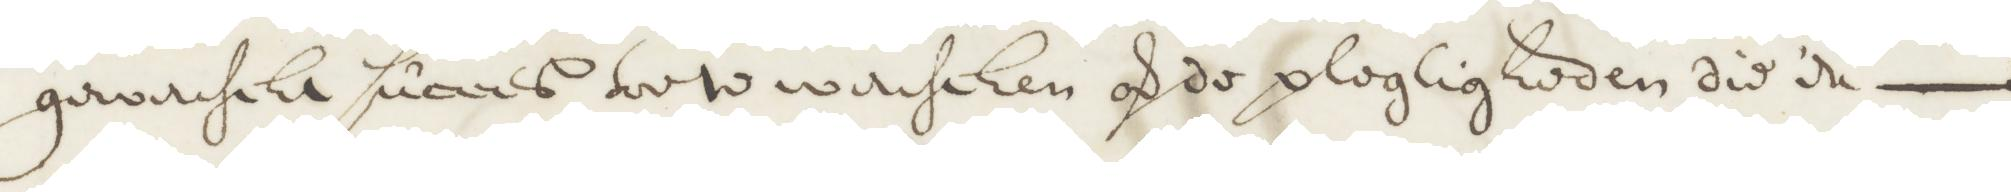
gewenscht succes toe te wenschen over de plegtigheden die er —
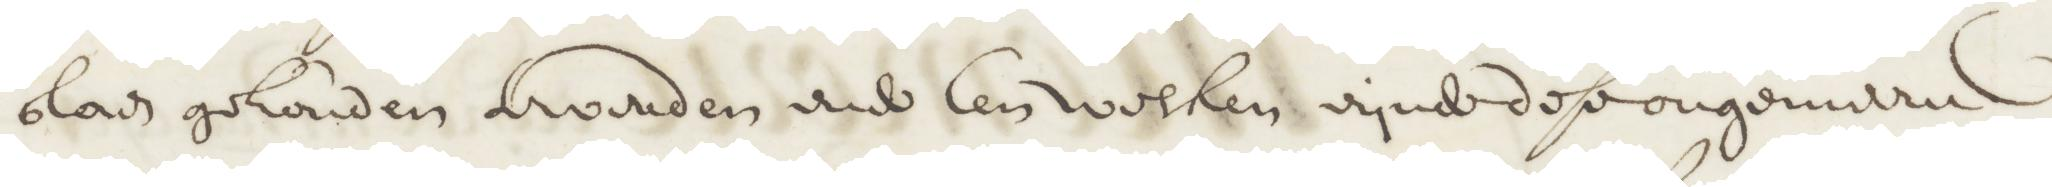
staen gehouden tewerden ende ten welken eijnde dese ongemeene
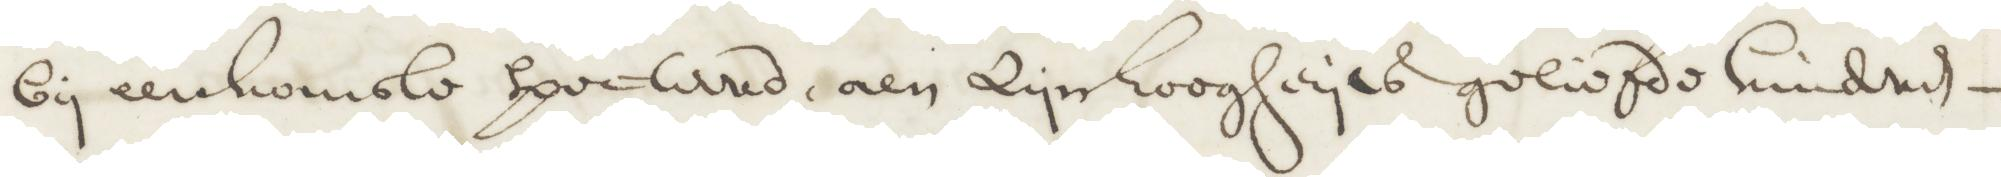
bij een komste specteerd, en Zijn hoogheijts geliefde kinderen -
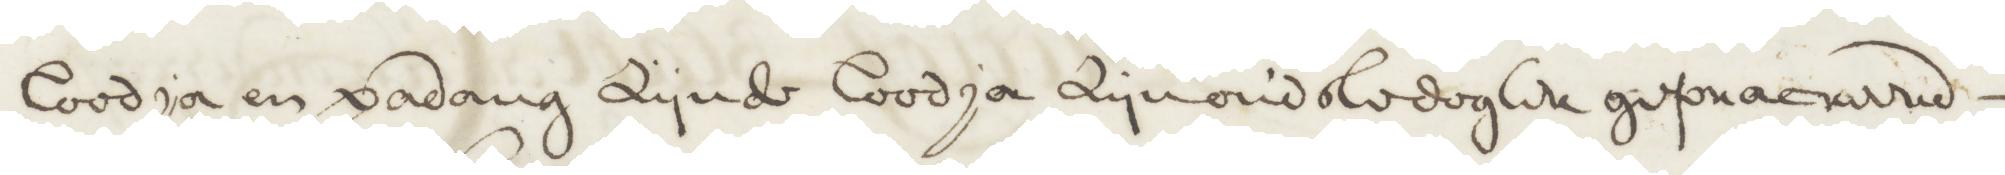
loodja en padang Zijnde loodja Zijn oudste dogter geprocreerd
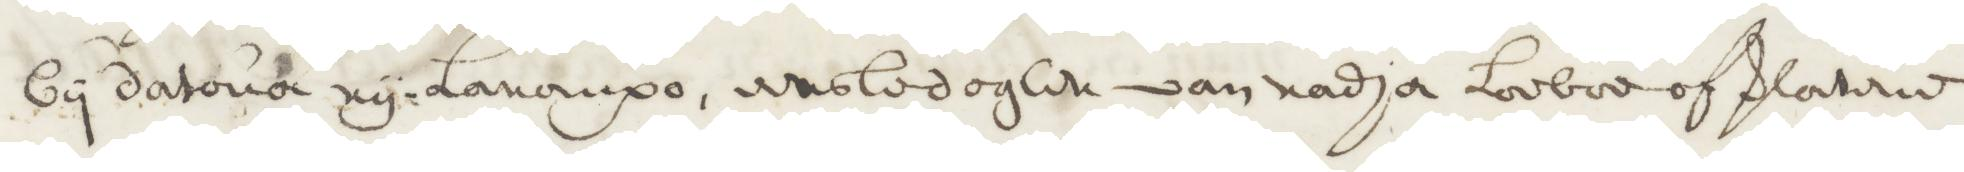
bij datoua rij-Larampo, eerste dogter van radja Loeboe of verlatene
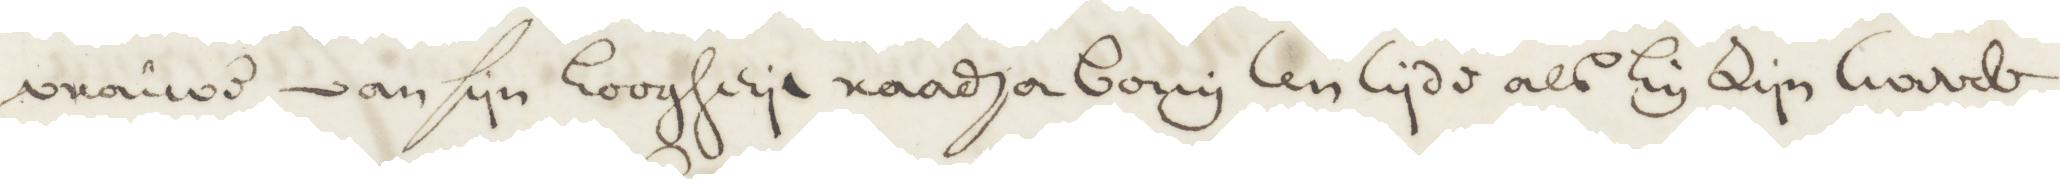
vrouwe van Sijn hoogheijt raadja bonij ten tijde als hij Zijn tweede
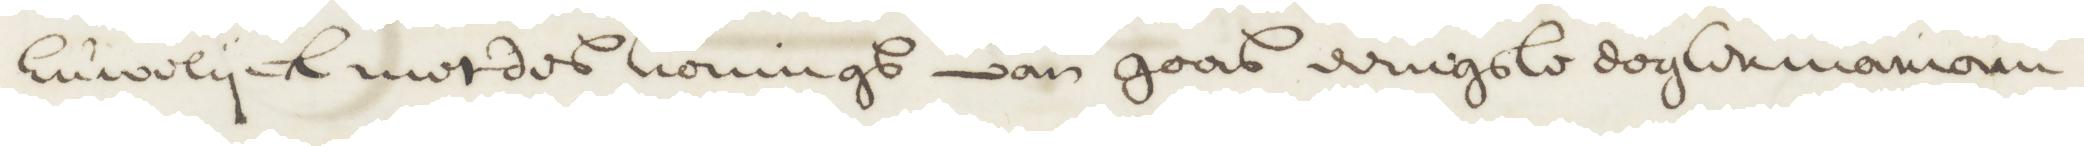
huwelijck met des konings van goas eenigste dogter mariam
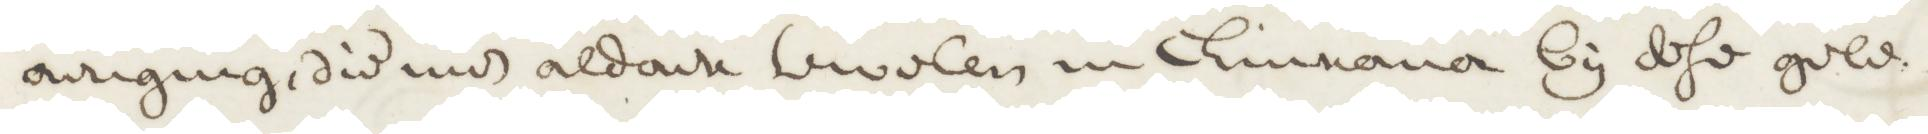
aenging, die men aldaer teweten in Chinrana bij dese gele.
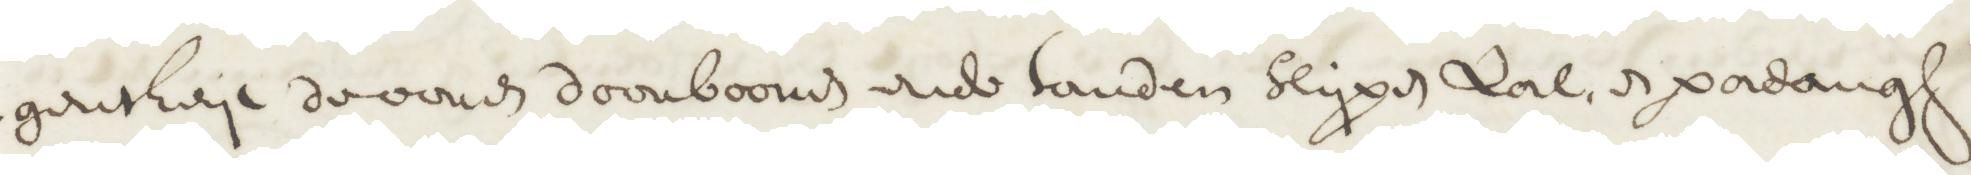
gentheijt de ooren doorbooren ende tanden slijpen Zal, en padangh
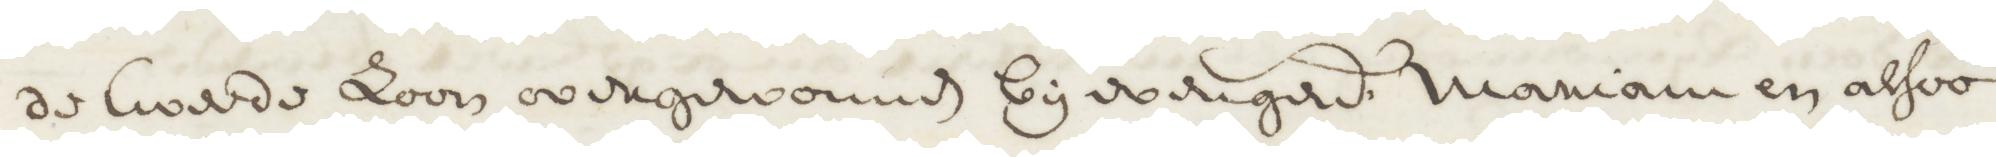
de tweede Zoon overgewonnen bij evengen:e Mariam en alsoo
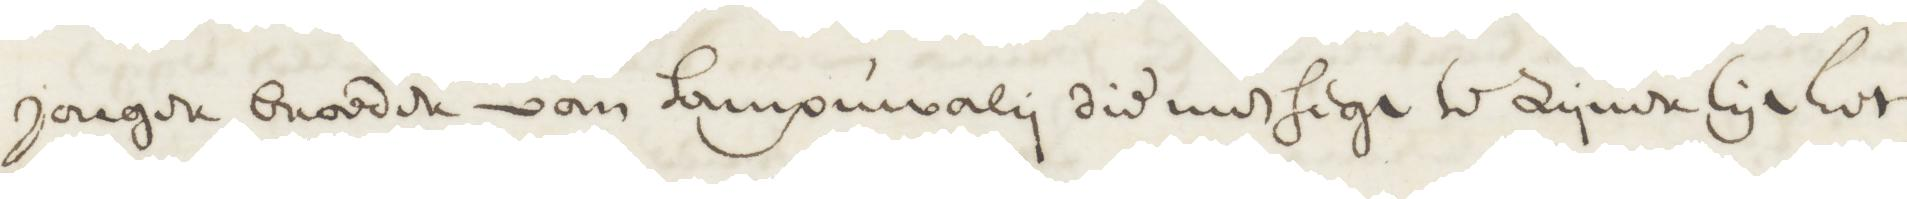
jonger broeder van Sampuwalij die men segt te Zijner tijt het
